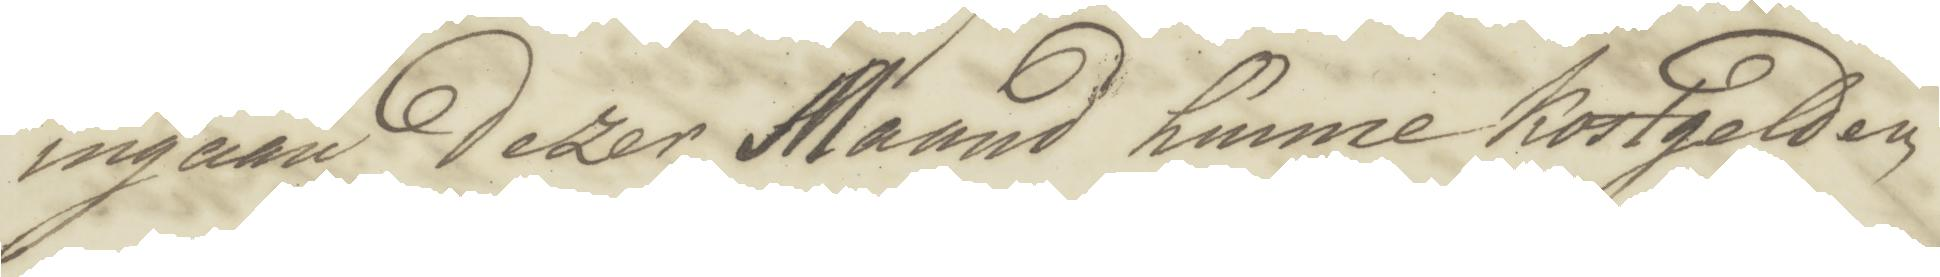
ingaan dezer Maand hunne kostgelden
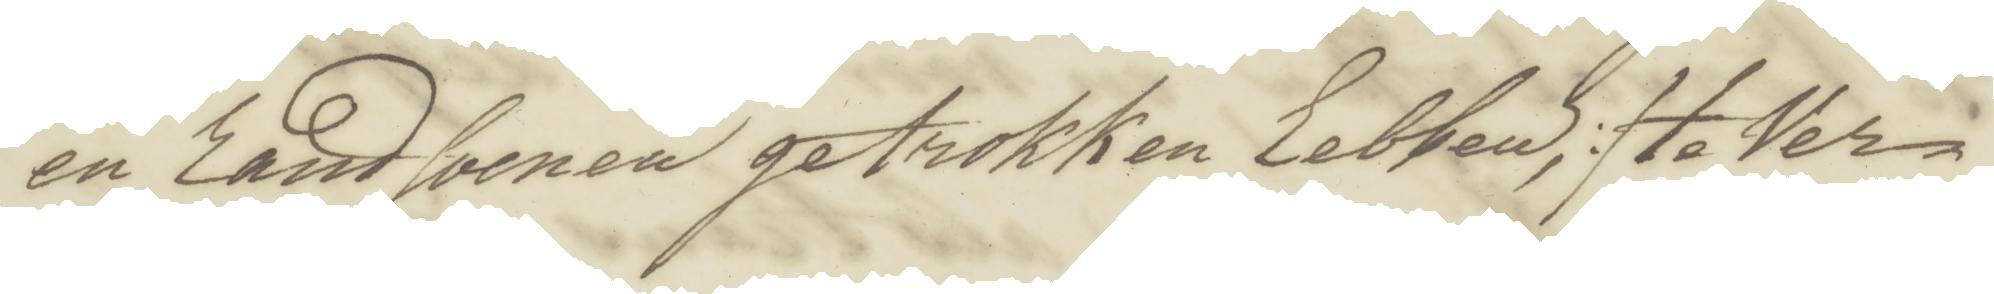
en randsoenen getrokken hebben,:/ te Ver
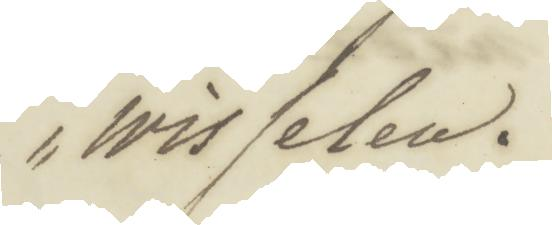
„wisselen.
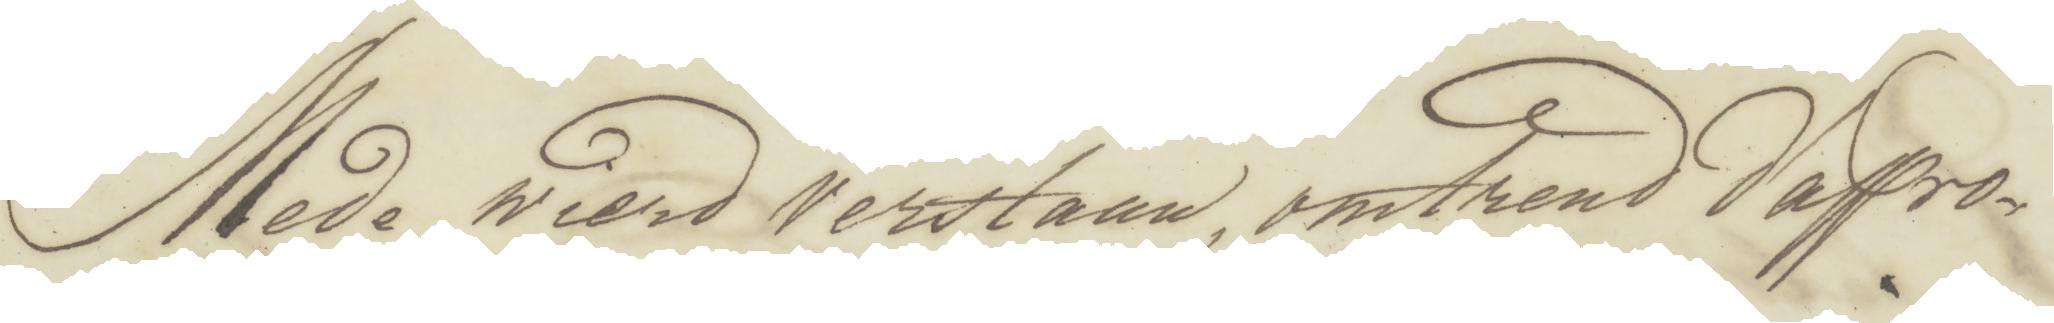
Mede wierd verstaan, omtrend d'appro-,
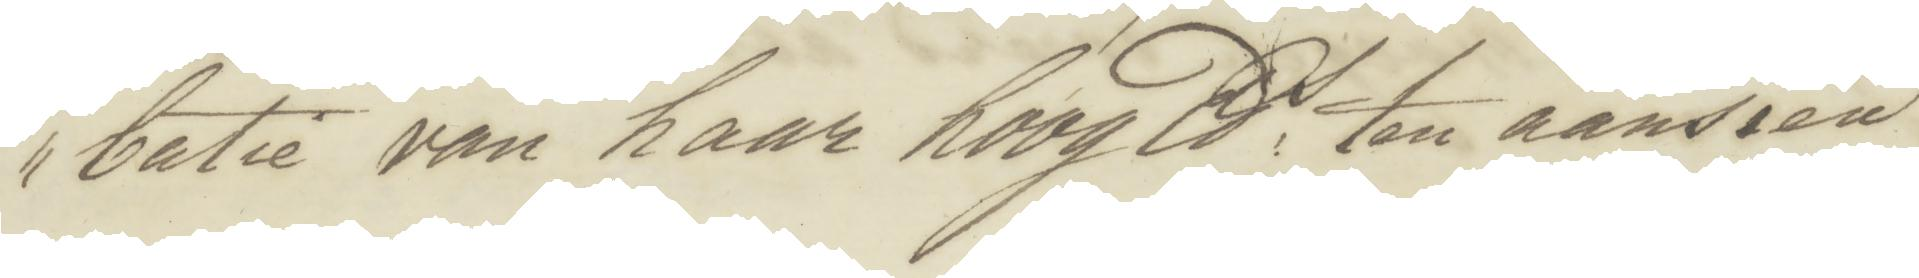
„batie van haar hoog Ed:s ten aansien
